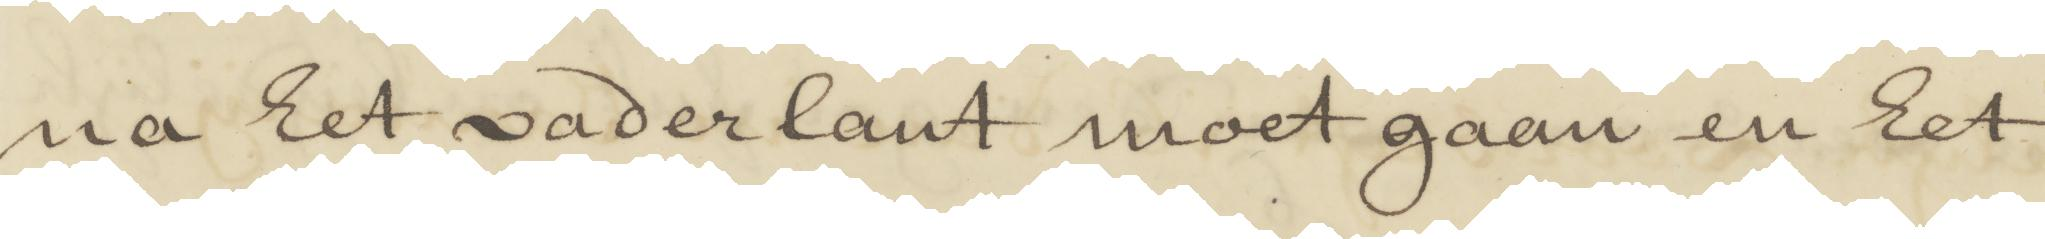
na het vaderlant moet gaan en het
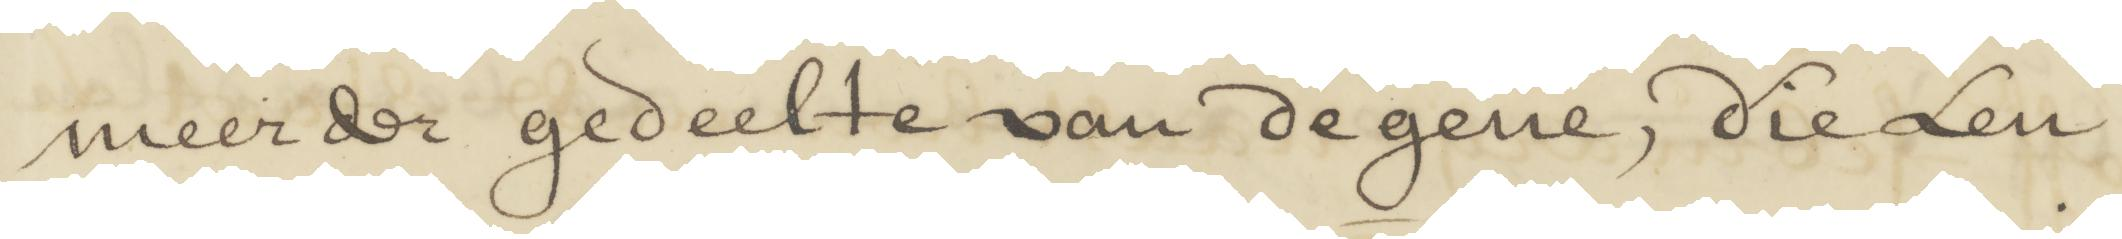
meerder gedeelte van de gene, die ten
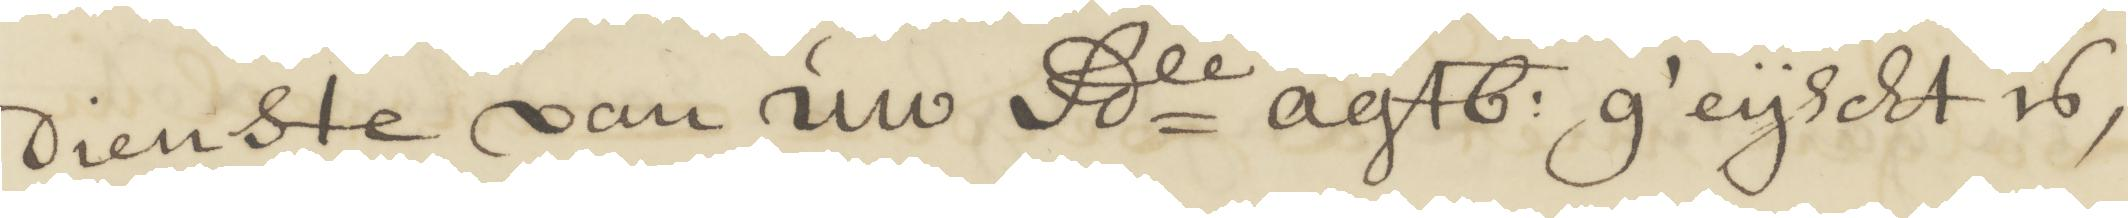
dienste van uw Ed=le agtb: g’eijscht is,
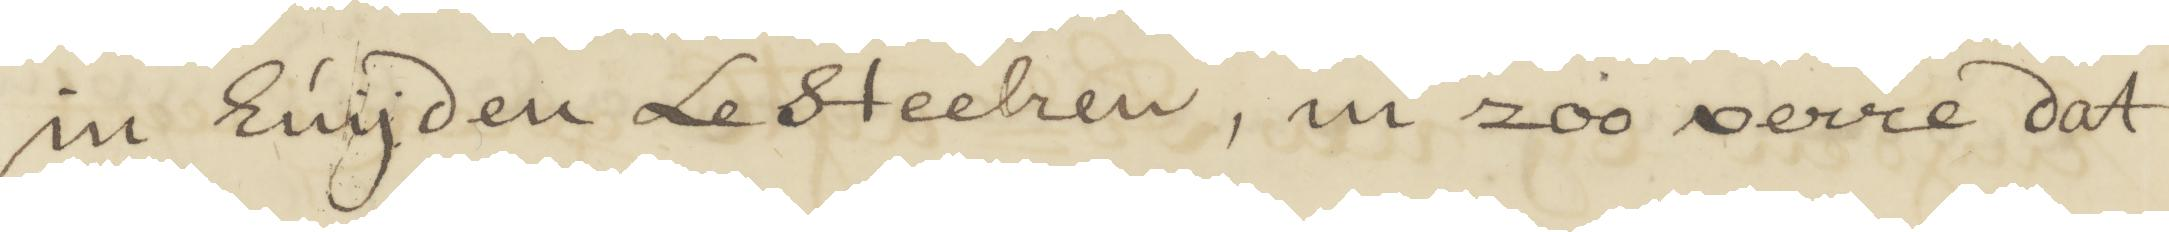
in huijden te steeken, in zoo verre dat
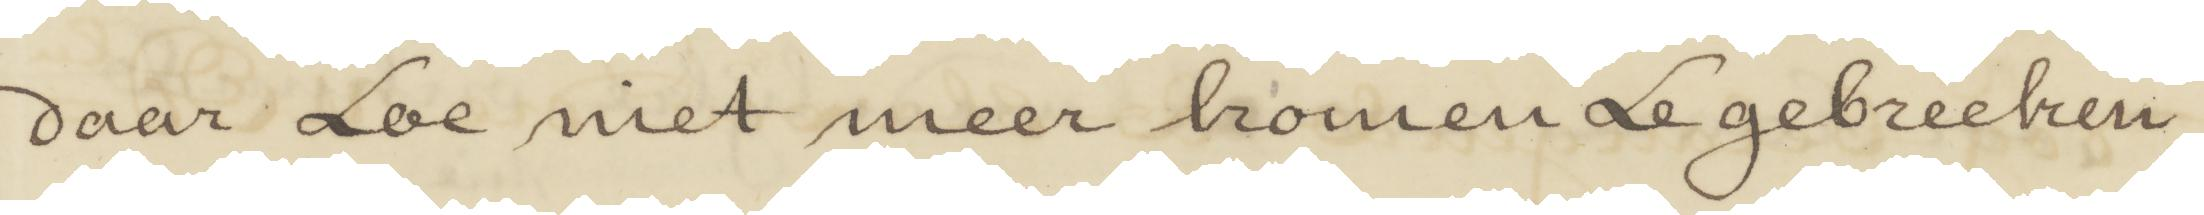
daar toe niet meer komen te gebreeken
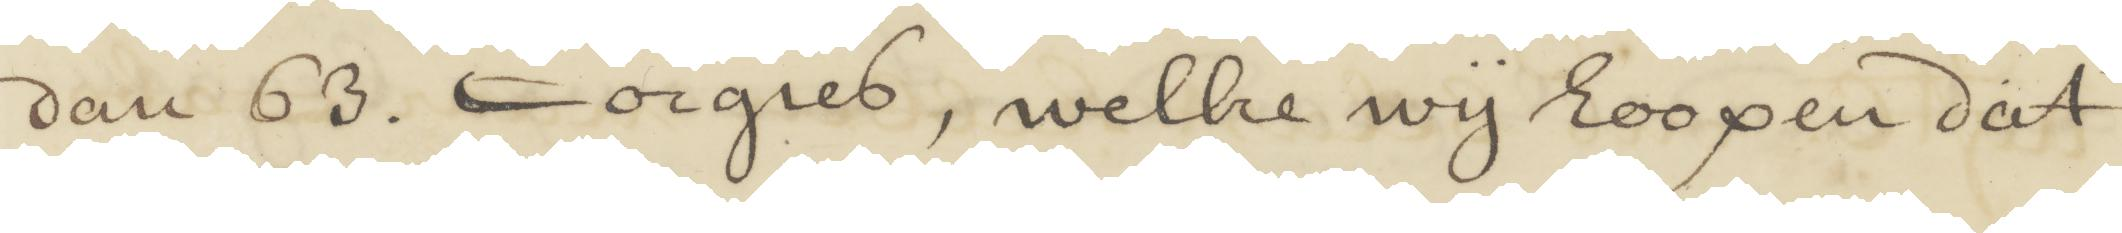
dan 63. Corgies, welke wij hoopen dat
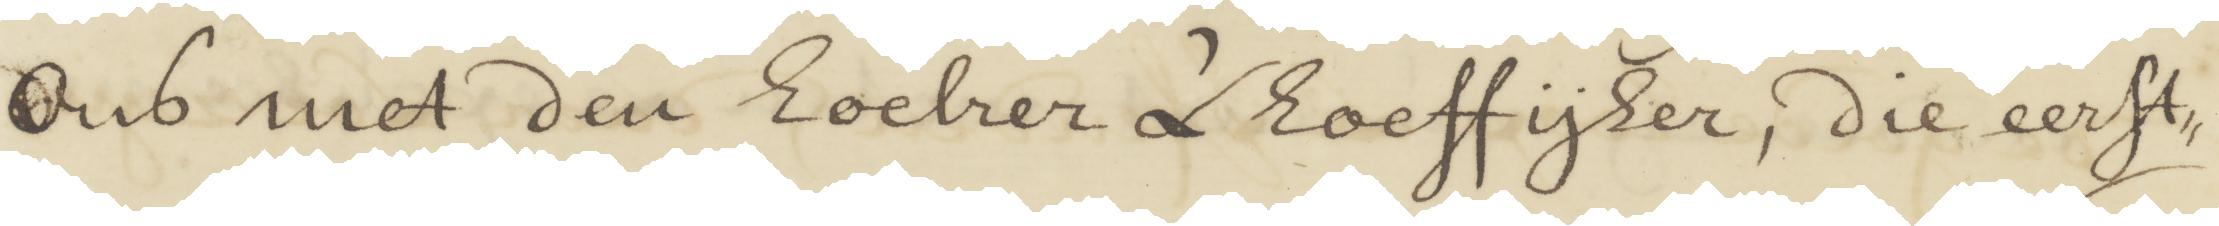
ons met den hoeker 't hoeffijser, die eerst„
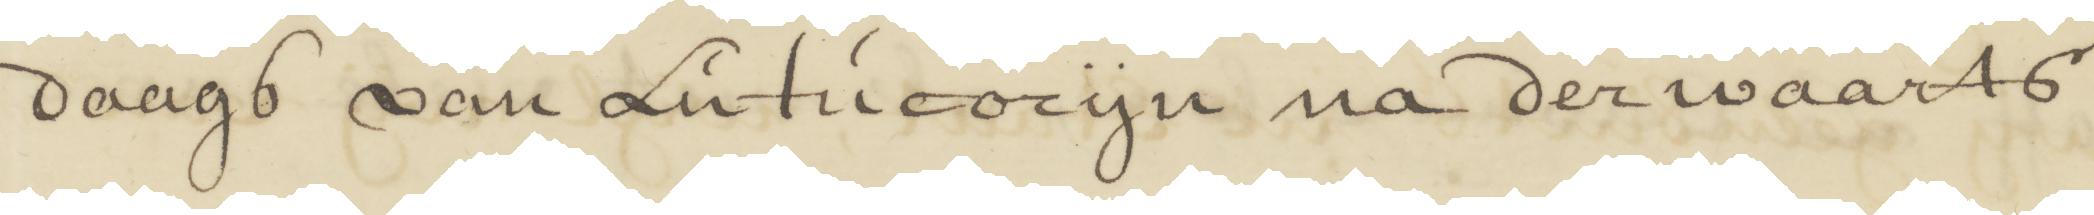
daags van tutucorijn na der waarts
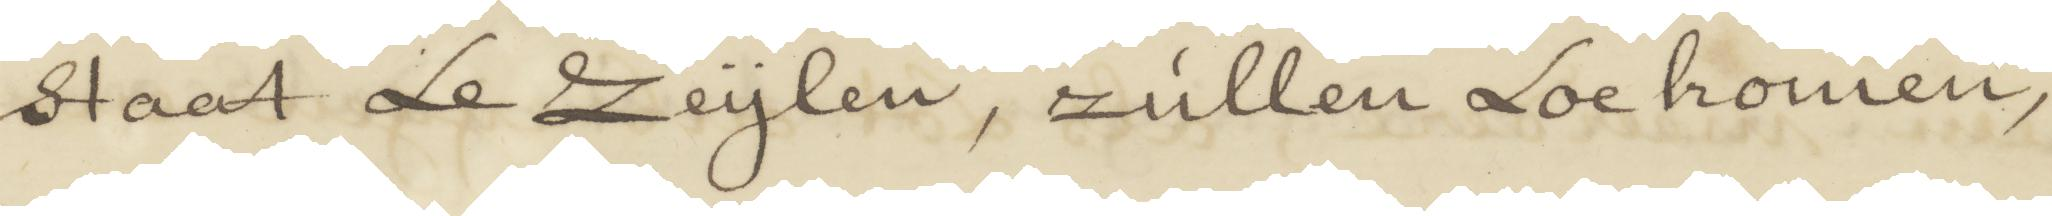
staat te zeijlen, zullen toekomen,
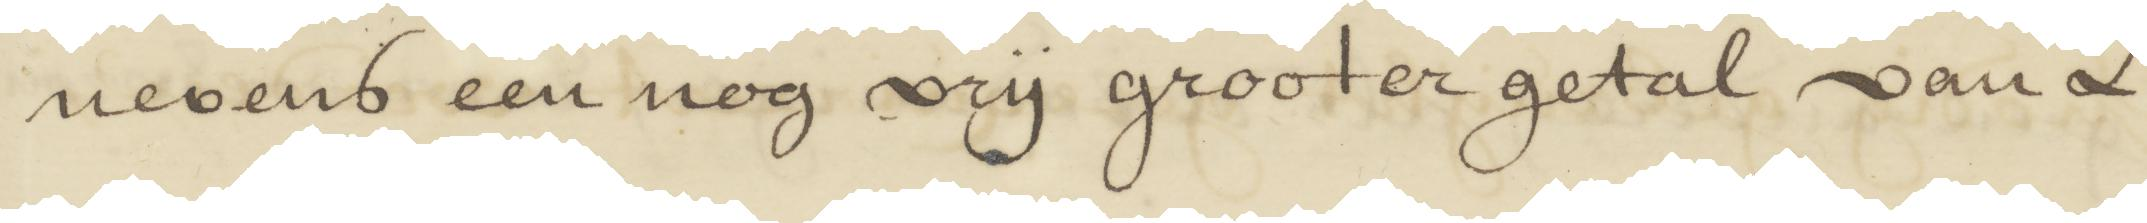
nevens een nog vrij grooter getal van 't
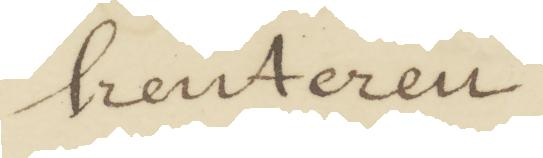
kenteren
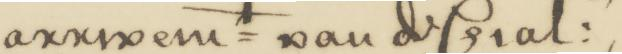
arrivem=t van de Chial:en
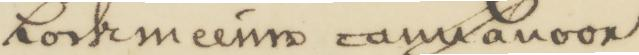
korkmeeuw cannanoor
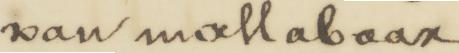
van mallabaar
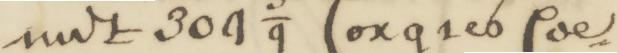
met 304¾ Corgies Coe„
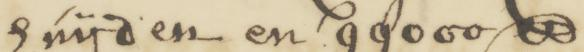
huijden en 99000 lb
